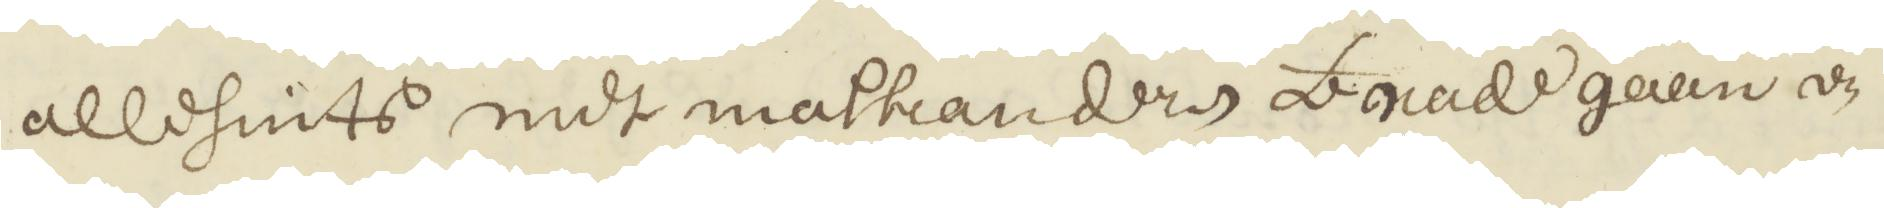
allesints met malkanderen te rade gaan en
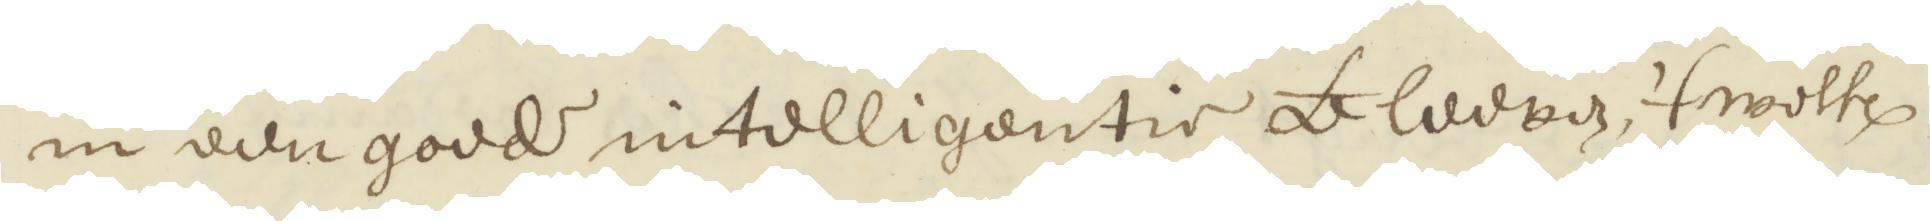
in een goede intelligentie te leeven, 't welk
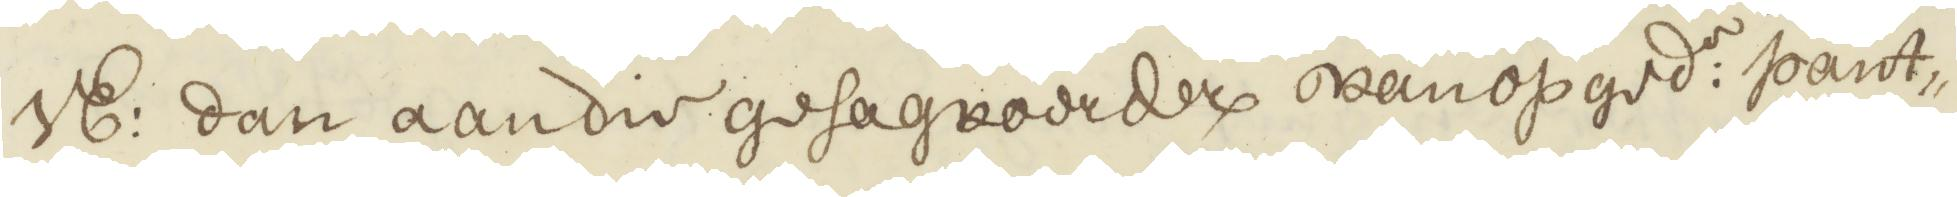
UE: dan aan die gesagvoerder van op ged:e pant„
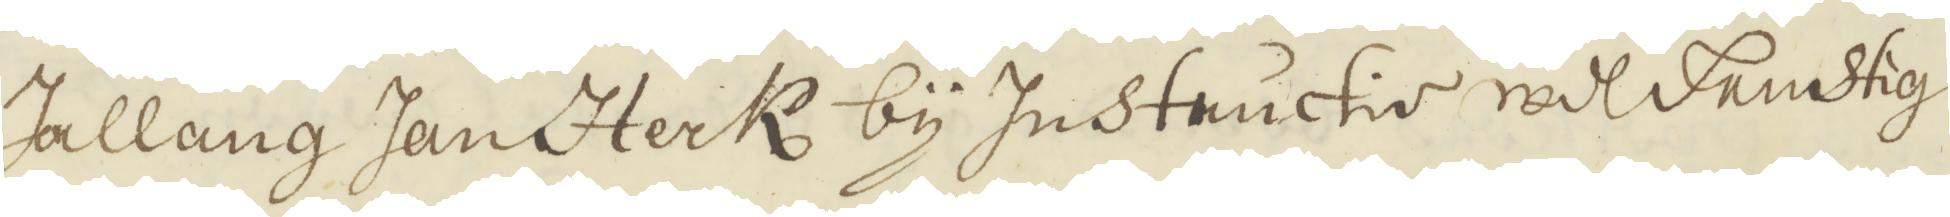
Jallang Jan Herk bij Jnstructe wel Ernstig
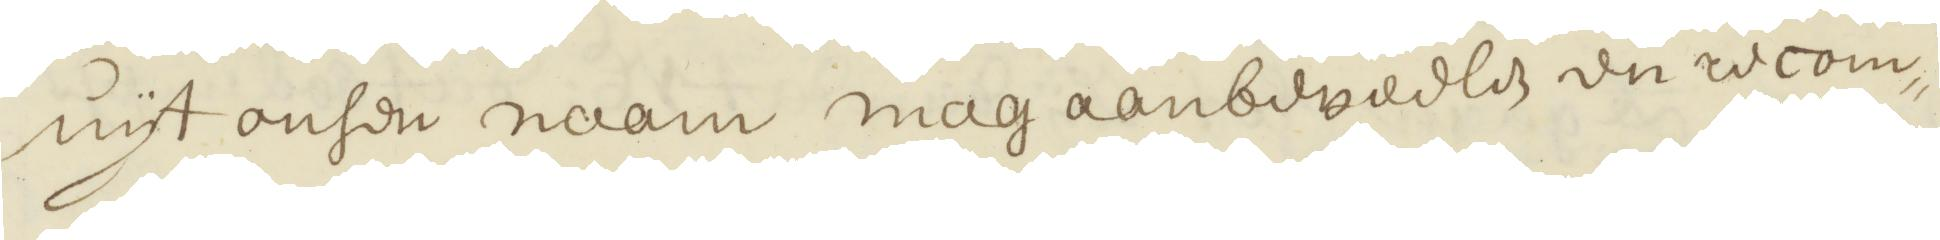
uijt onsen naam mag aanbeveelen en recom„
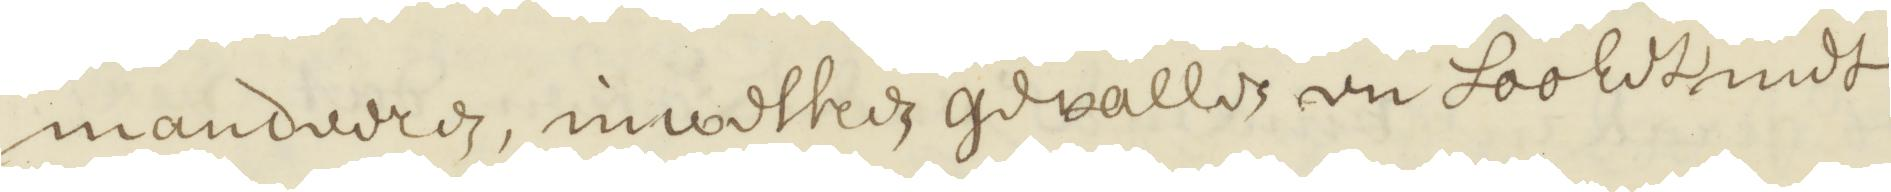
„mandeeren, inwelken gevallen en soo het niet
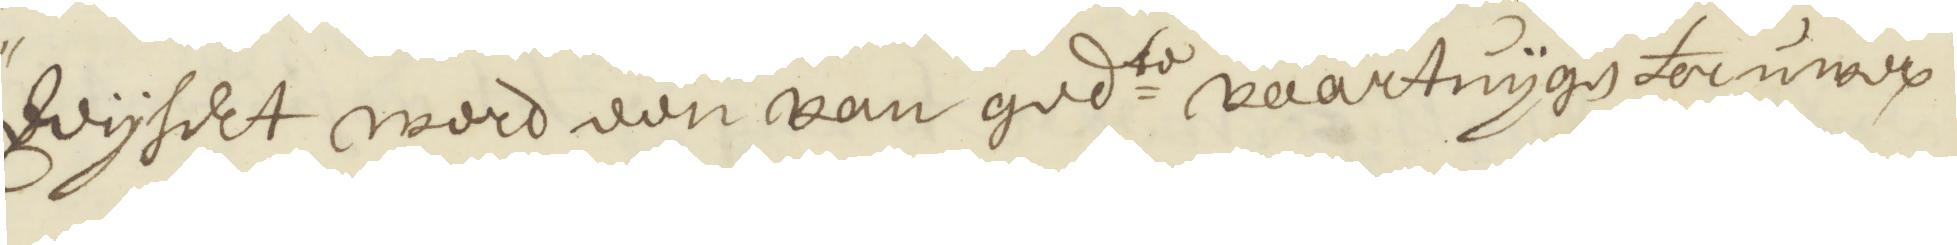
vereijscht werd een van ged=te vaartuijgen ter uwer
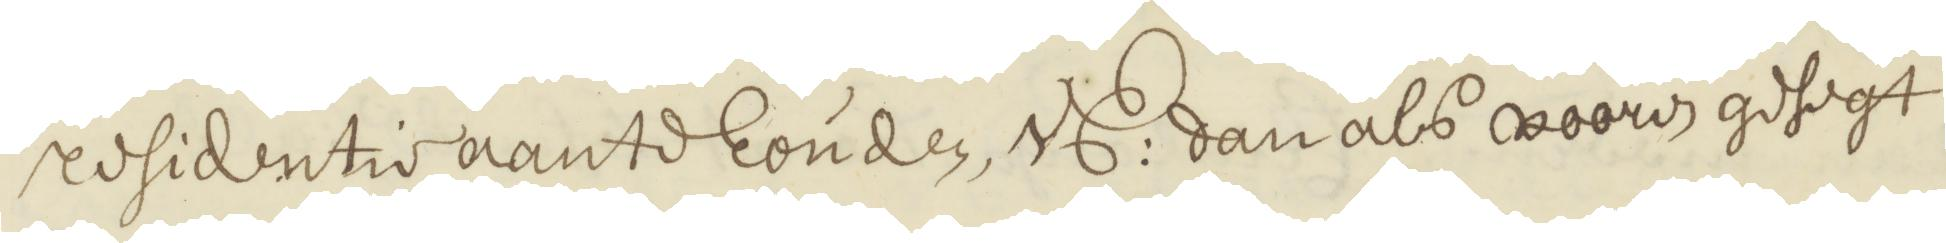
residentie aan te houden, UE: dan als vooren gesegt
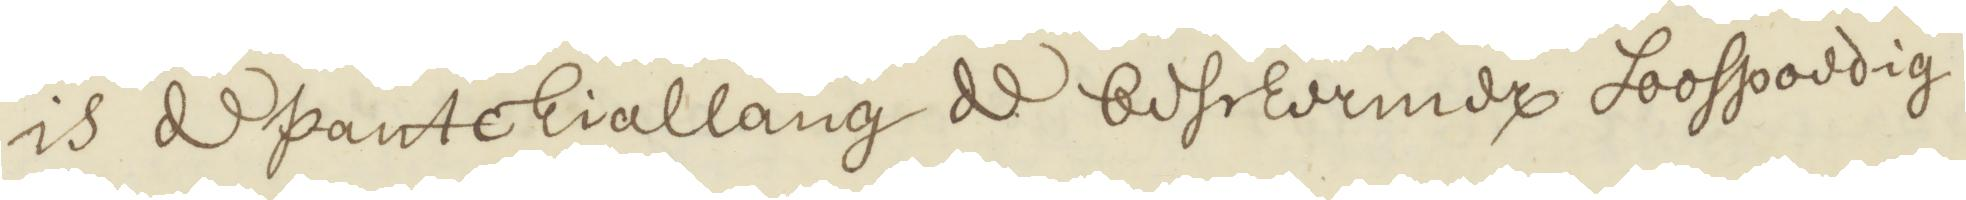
is de pantchiallang de beschermer soospoedig
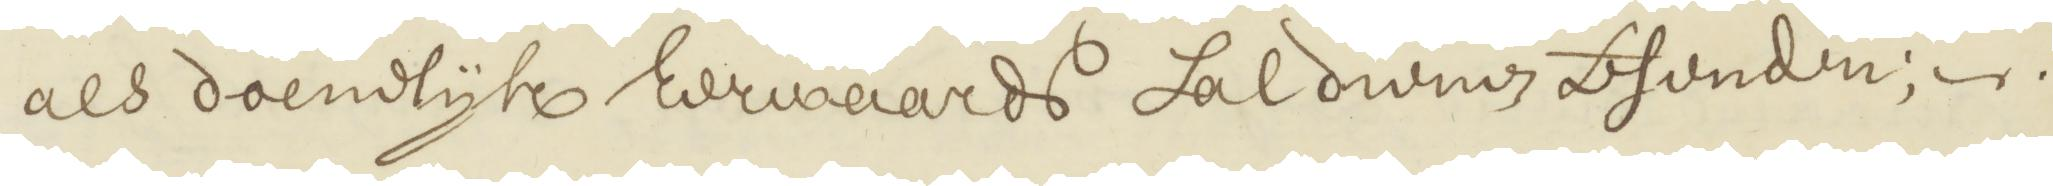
als doenelijk herwaards sal dienen tesenden; — .
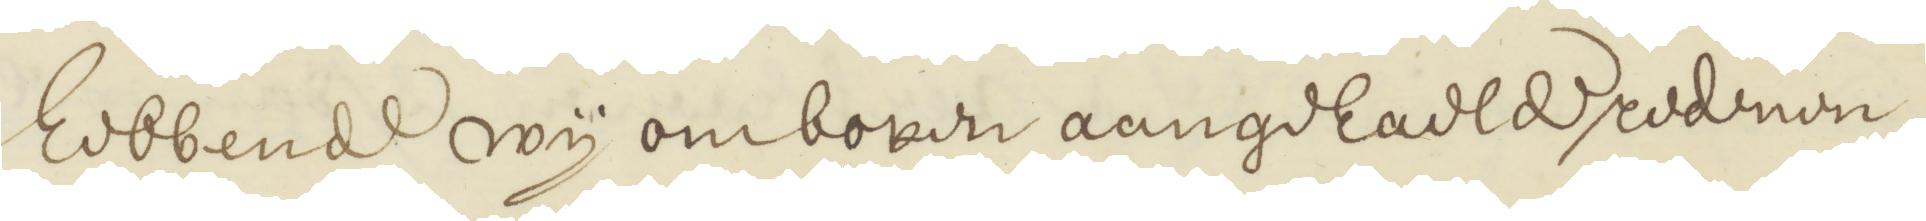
hebbende wij om boven aangehaelde redenen
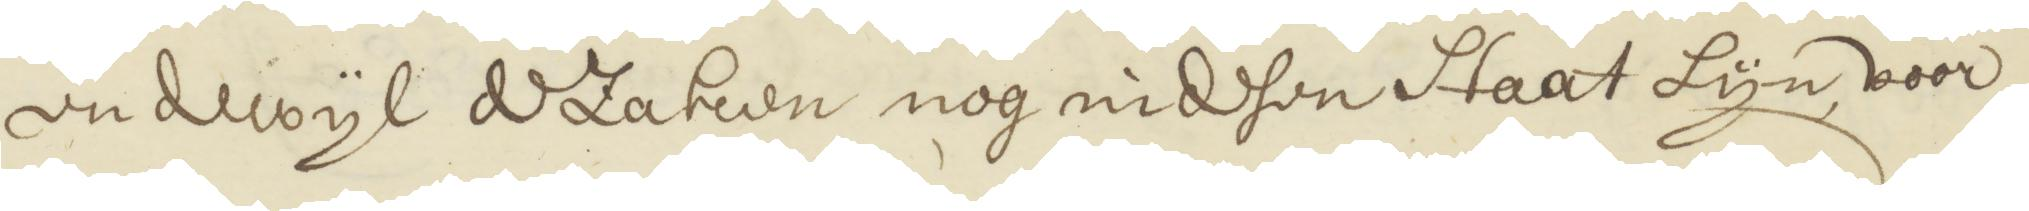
en dewijl de zaken nog in desen staat sijn voor
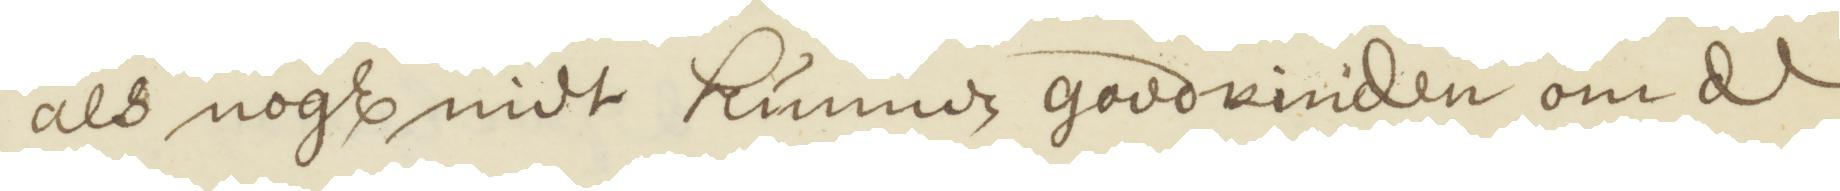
als nogh niet kunnen goedvinden om de
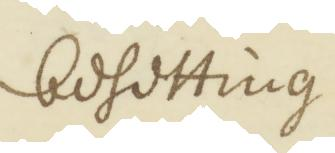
besetting
